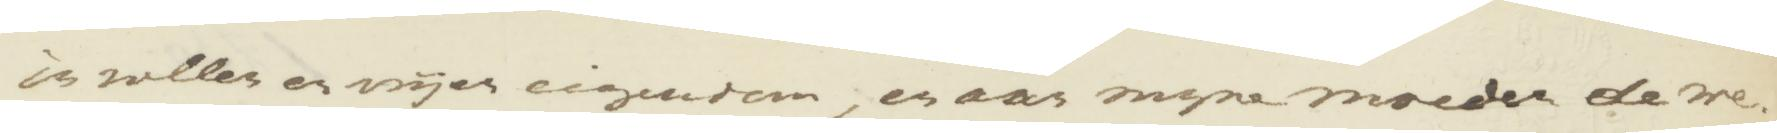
in vollen en vrijen eigendom, en aan myne moeder de we„
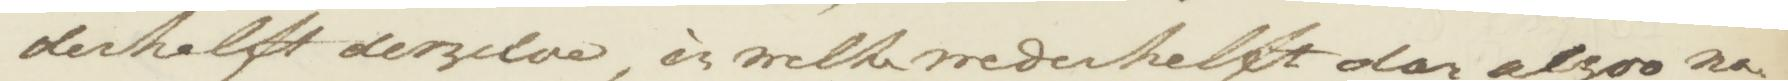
derhelft derzelve, in welke wederhelft dan alzoo na
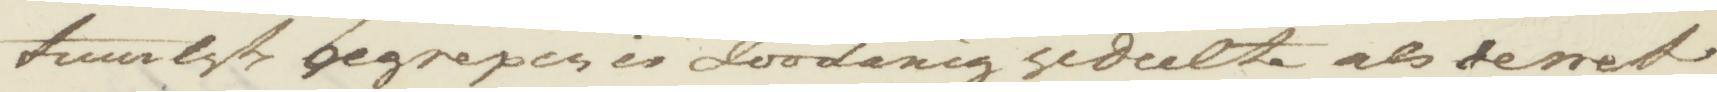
tuurlyk begrepen is zoodanig gedeelte als de wet
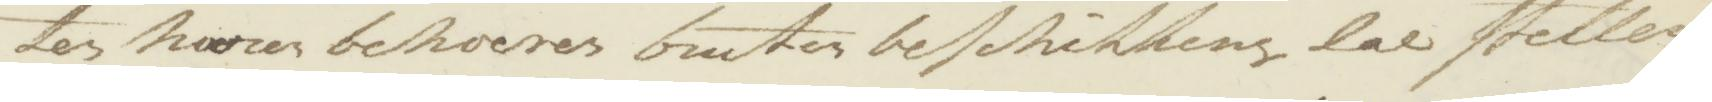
ten haaren behoeven buiten beschikking zal stellen,
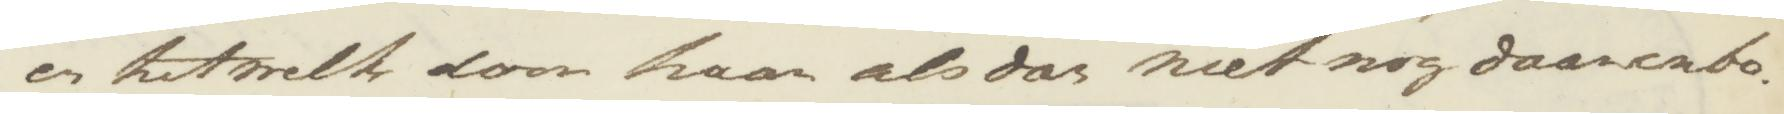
en hetwelk door haar als dan niet nog daarenbo„
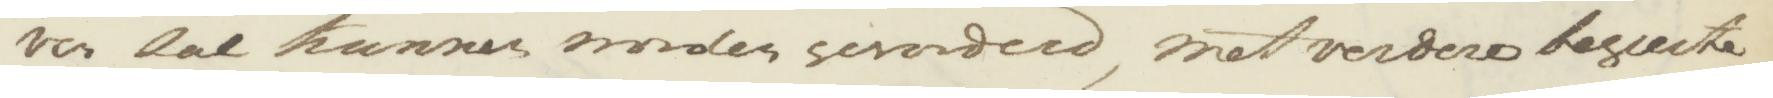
ven zal kunnen worden gevorderd, met verdere begeerte
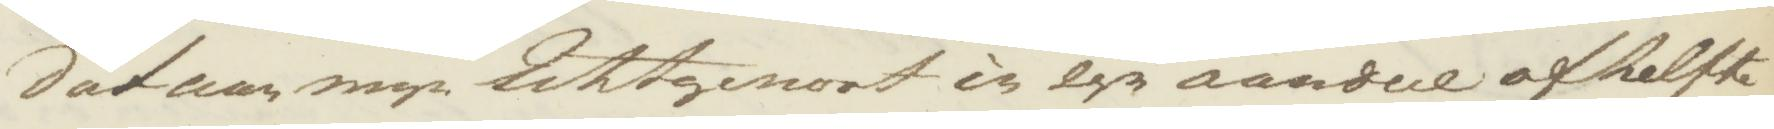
dat aan myn Echtgenoot in zyn aandeel of helfte
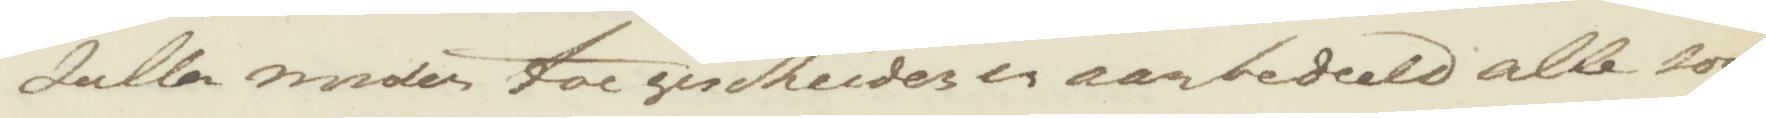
zullen worden toe gescheiden en aanbedeeld alle zoo
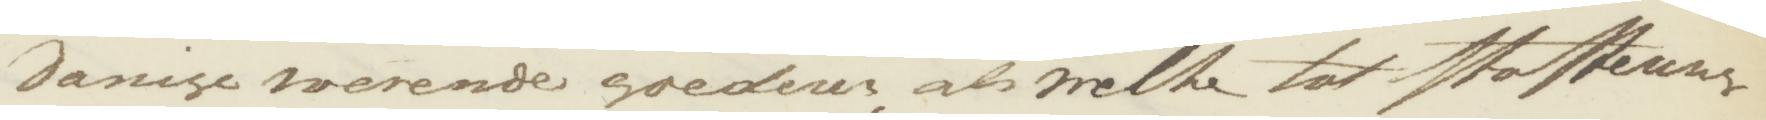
danige roerende goederen, als welke tot stoffering
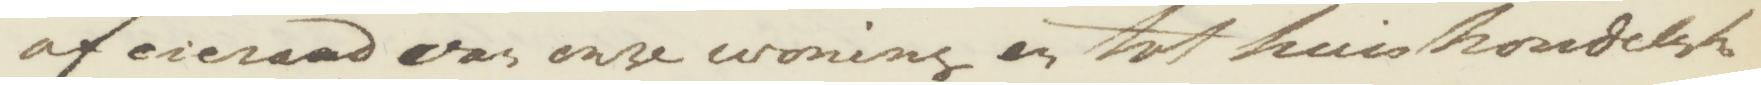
of cieraad van onze woning en tot huishoudelyk
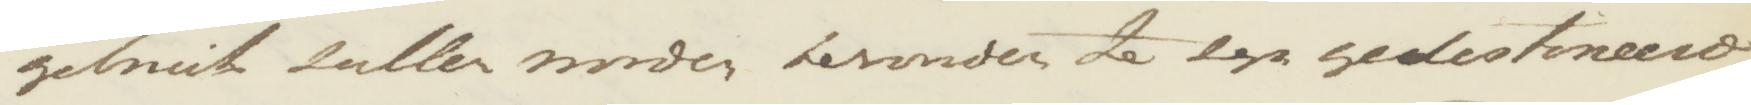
gebruik zullen worden bevonden te zyn gedestineerd
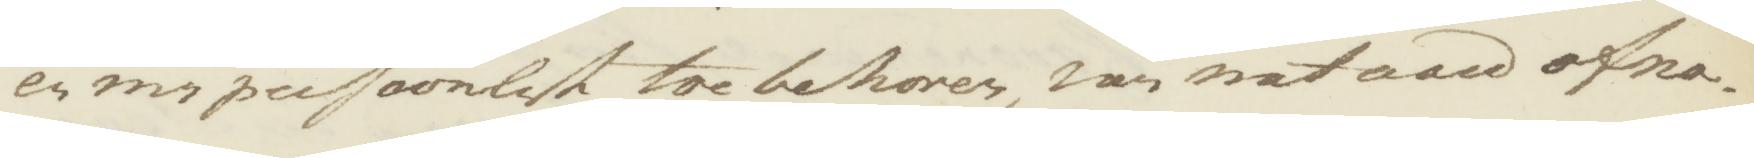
en my persoonlyk toe behoren, van wat aard of na„
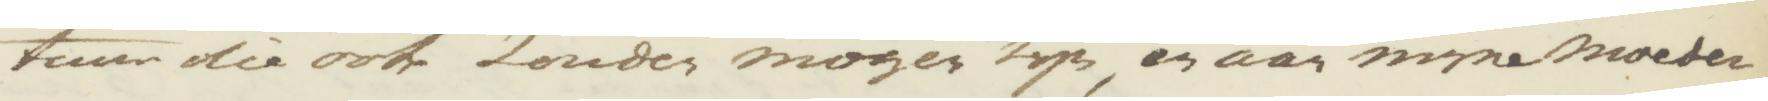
tuur die ook zouden mogen zyn, en aan myne moeder
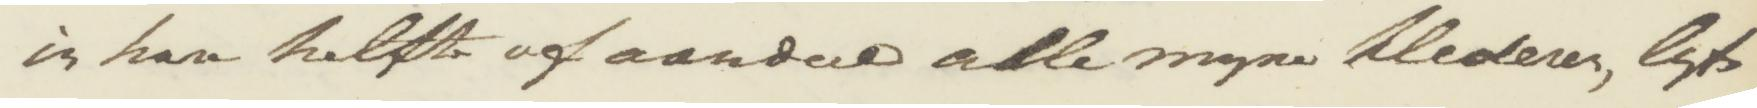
in hare helfte of aandeel alle myne klederen, lyfs
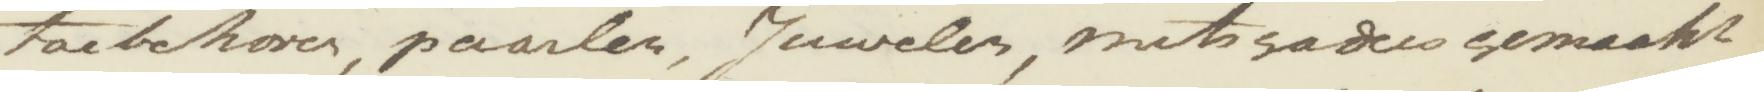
toebehoren, paarlen, Juwelen, mitsgaders gemaakt
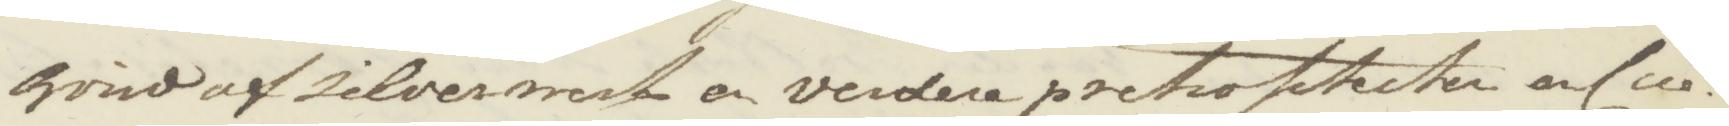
Goud of zilverwerk en verdere pretiositeiten en Cie„
